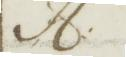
A:
